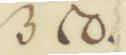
350.
